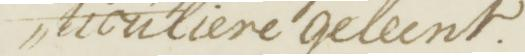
„ticuliere geleent.
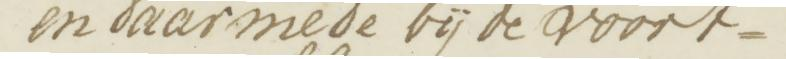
en daar mede bij de voort=
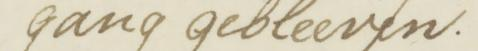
gang gebleeven.
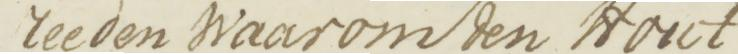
reeden waarom den Hout
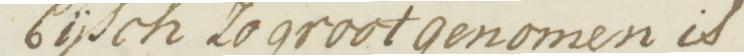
Eijsch zo groot genomen is
